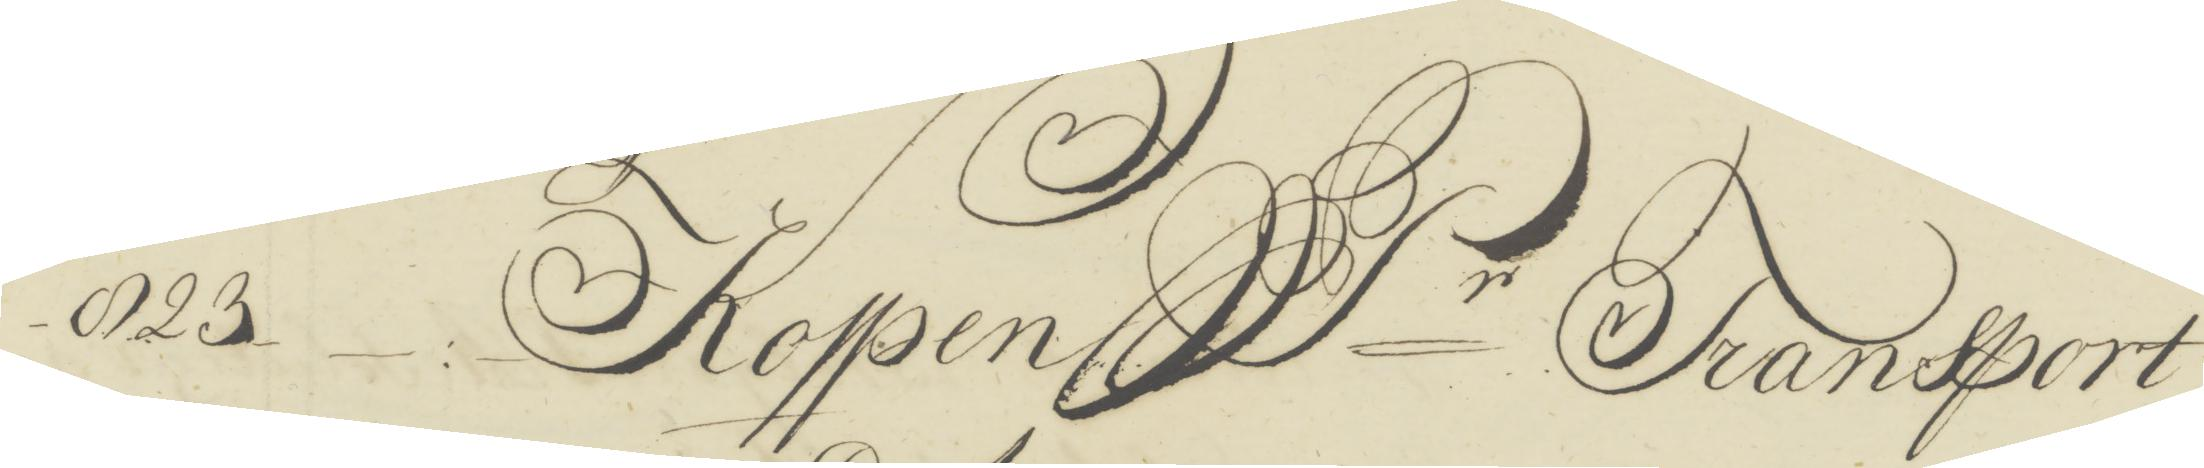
- 823 — : — Koppen P=r Transport
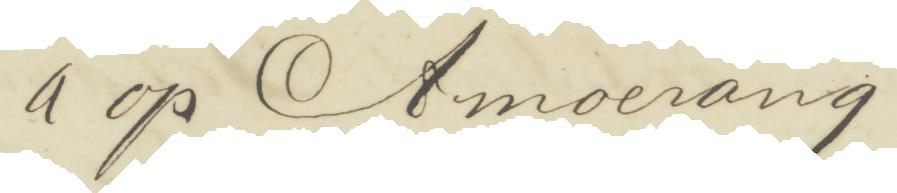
4 op Amoerang
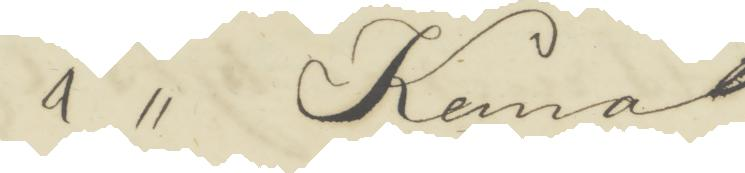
4 „ Kema
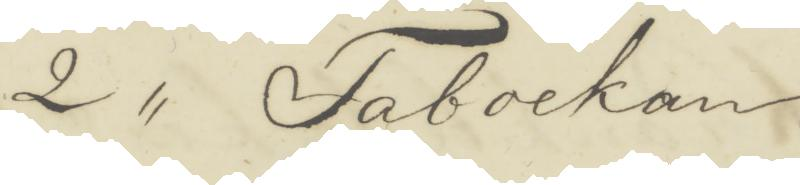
2 „ Taboekan
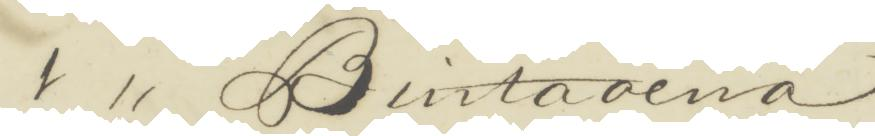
1 „ Bintaoena
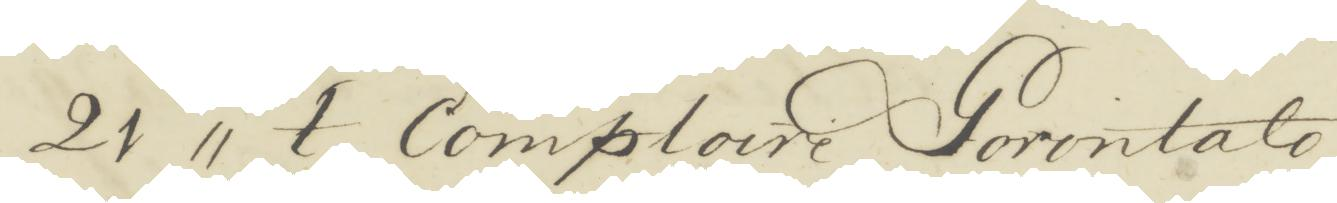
21 „ ’t Comptoire Gorontalo
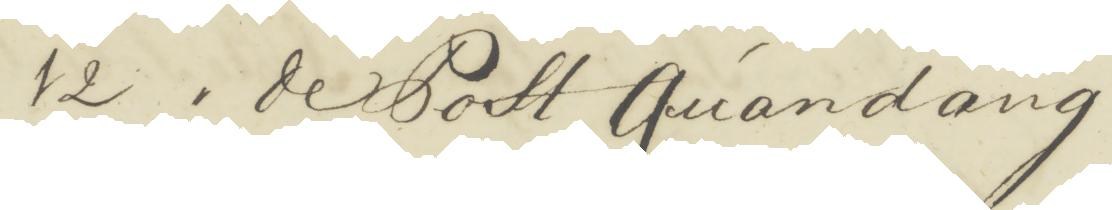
12 „ de Post Quandang
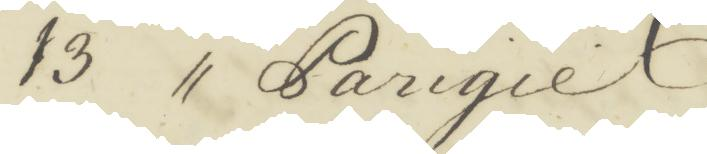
13 „ Parigie
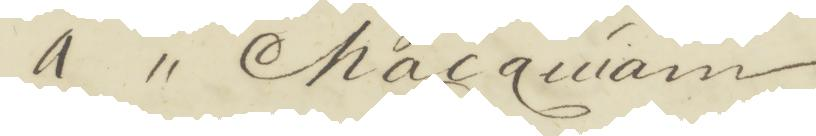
4 „ Macquam
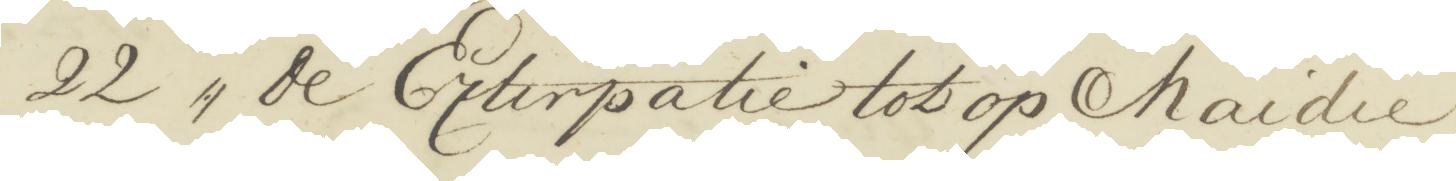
22 „ de Extirpatie tot op Maidie
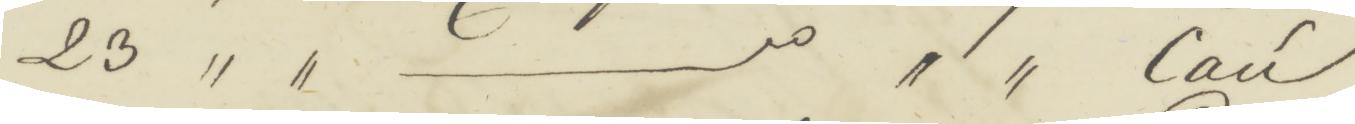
23 „ „ _o „ „ Cau
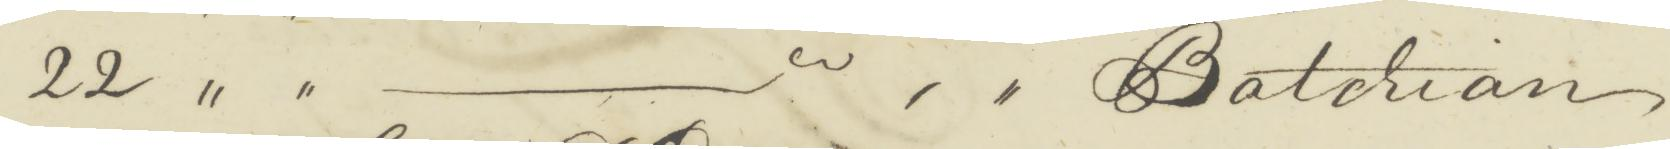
22 „ „ _o „ „ Batchian
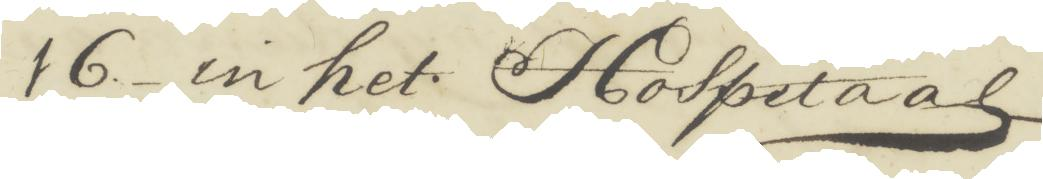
16 in het Hospitaal
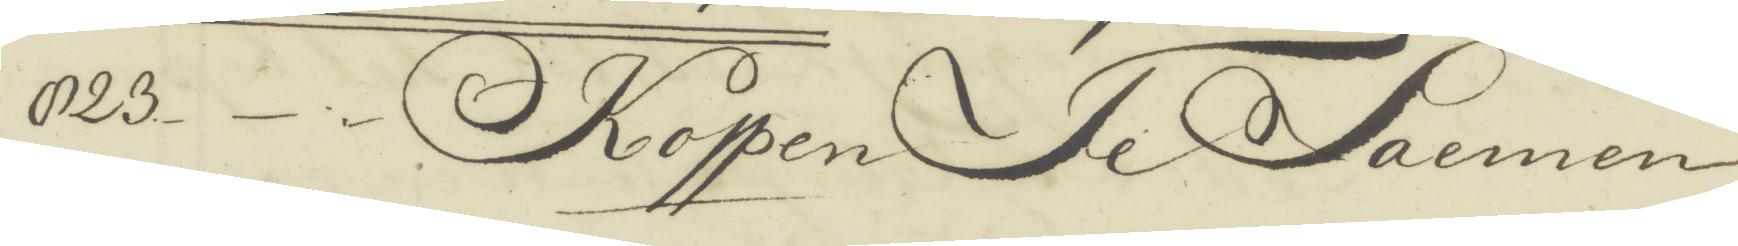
823. — : — Koppen Te Saemen
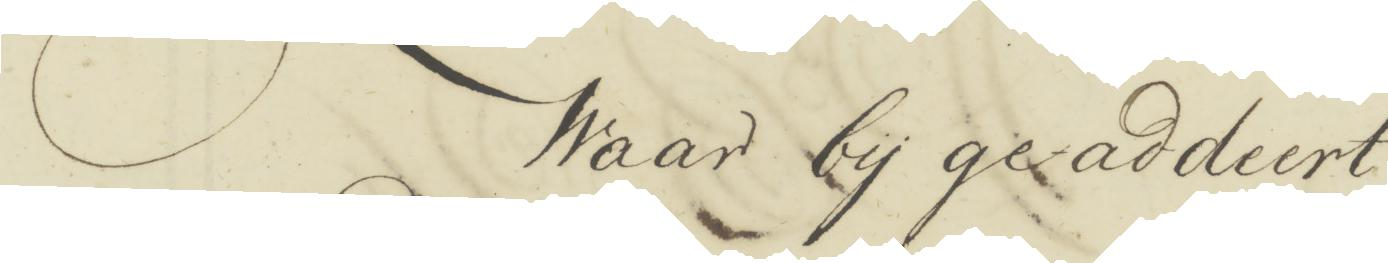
Waar bij ge-addeert
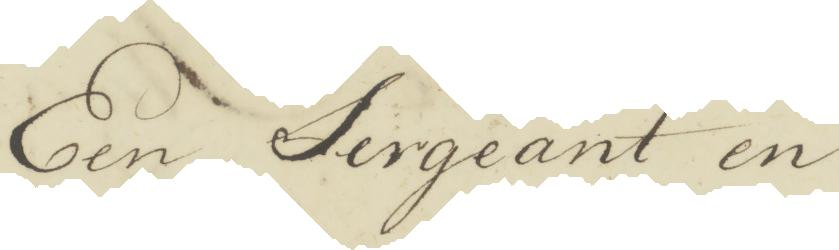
Een sergeant en
